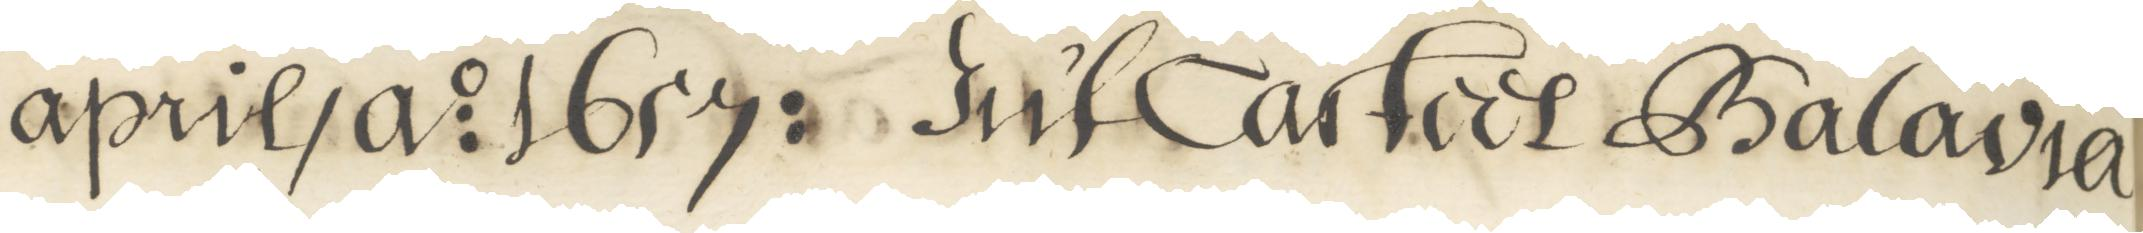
april / a:o 1657: In 't Casteel Batavia
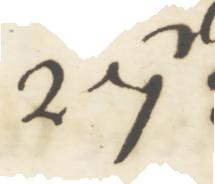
27e:
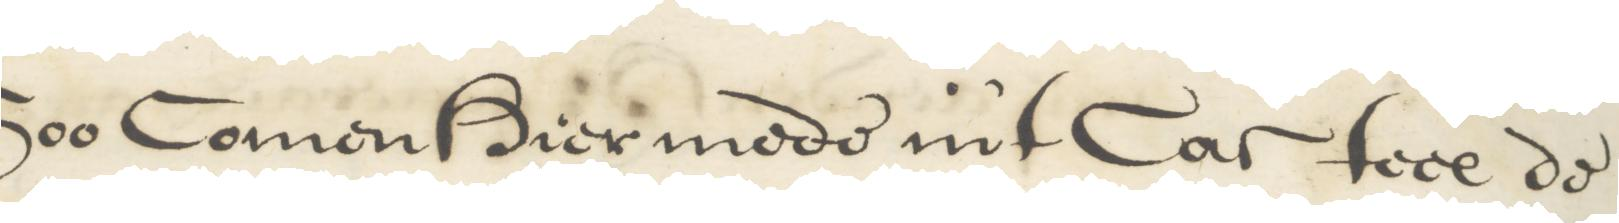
oo Comen hier mede in ’t Casteel de
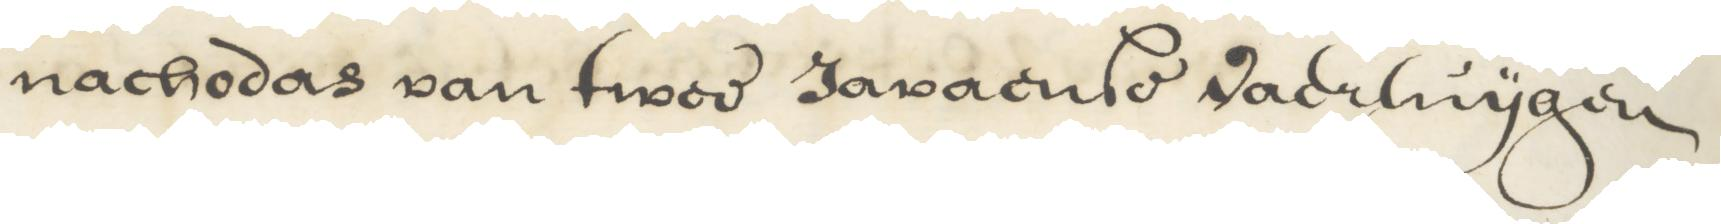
nachodas van twee Iavaense vaertuijgen
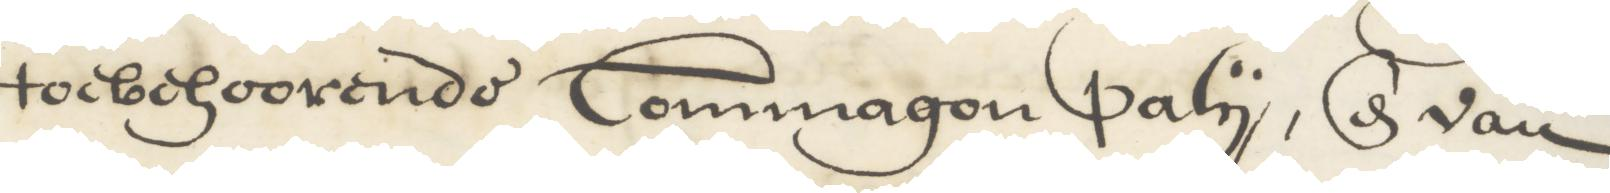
toebehoorende Commagon palij, ende van
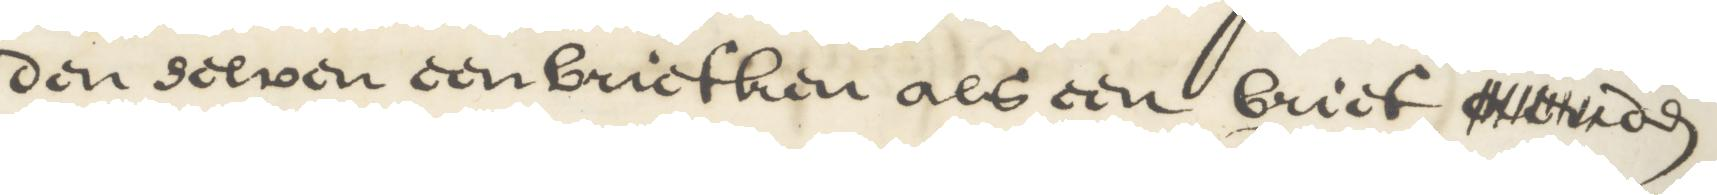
den selven een briefken als een brief aanden
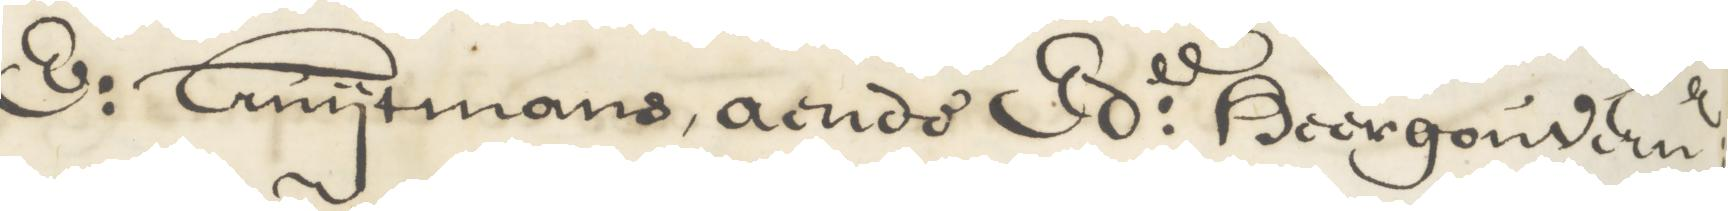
E: Cruijtmans, aende Ed:le Heer gouvern:r
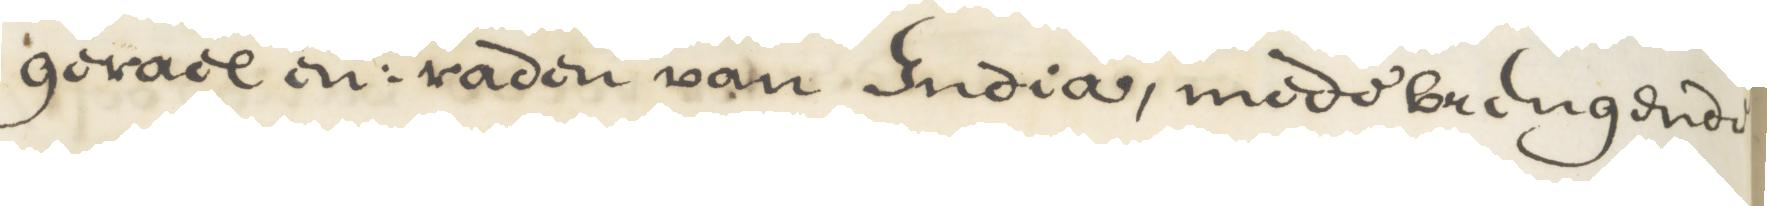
gerael en: raden van India, mede brengende
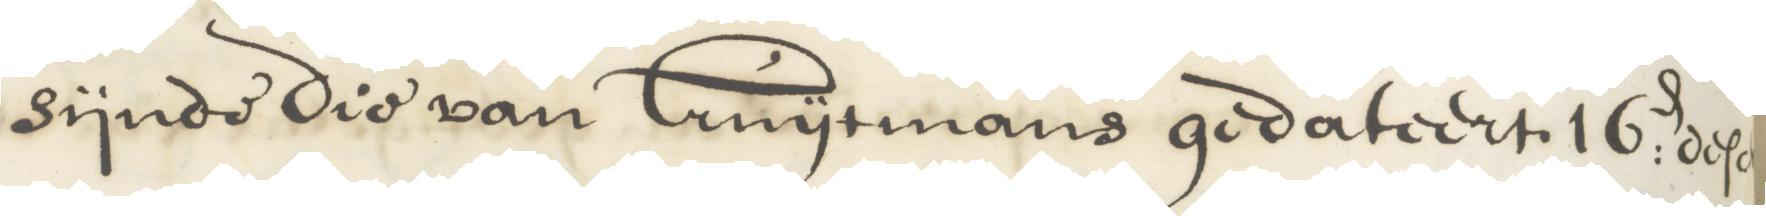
sijnde die van Cruijtmans gedateert 16:en dese
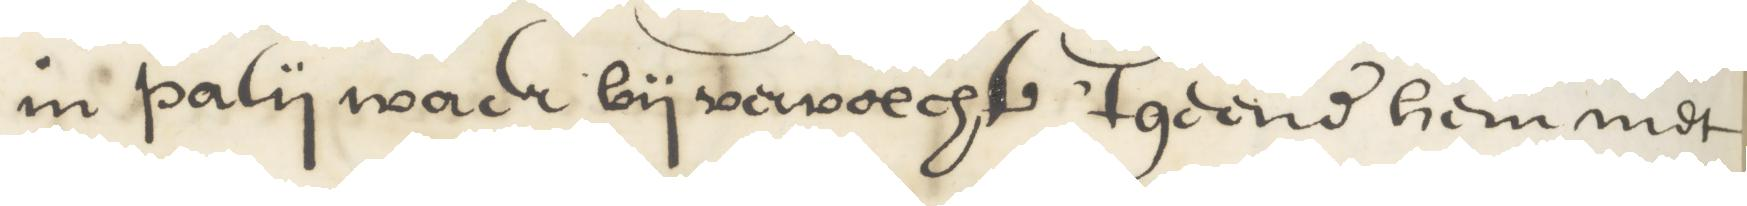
in palij waer bij vervolcht ’tgeene hem met
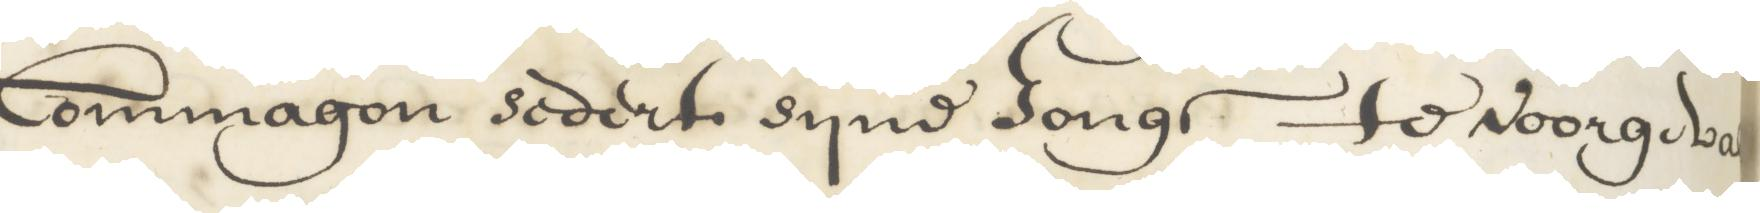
Commagon sedert sijne Iongs te voorgeva
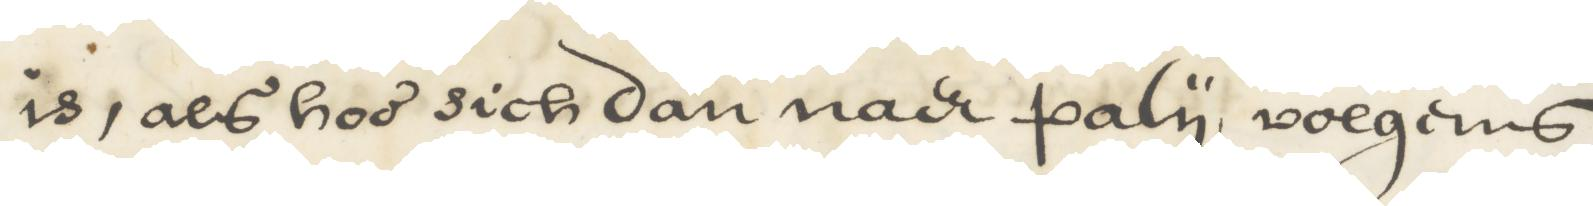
is, als hoe sich dan naer palij volgens
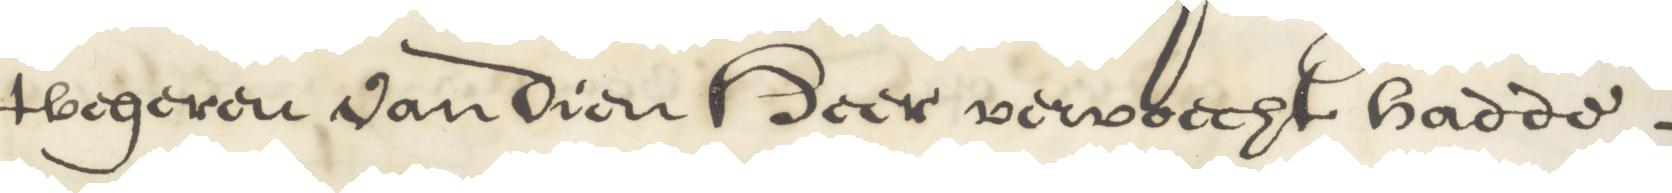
t begeren van dien Heer vervoecht hadde
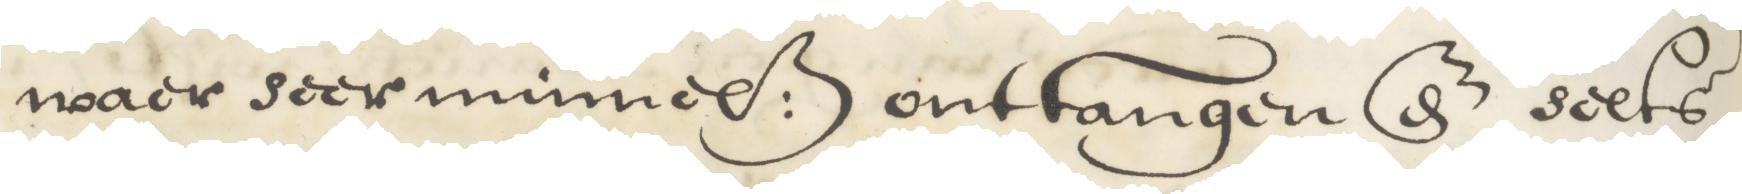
waer seer minnelijk ontfangen ende selfs
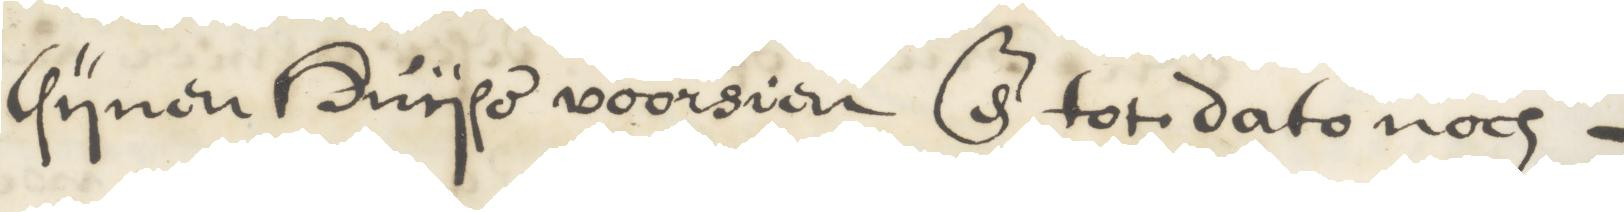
tsijnen Huijse voorsien ende tot dato noch
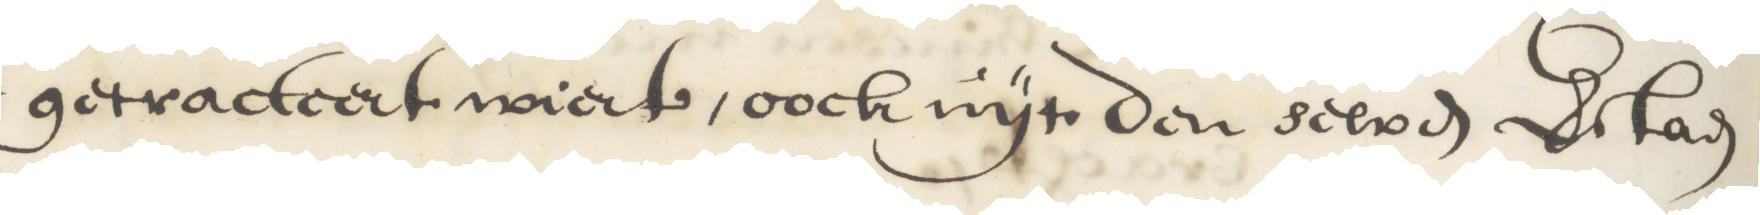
getracteert wiert, oock uijt den selven verstaen
